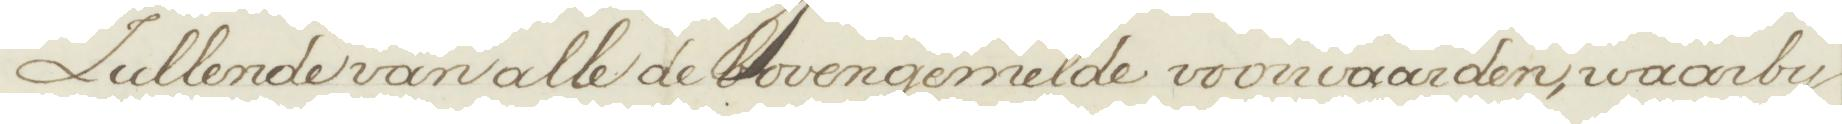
Zullende van alle de bovengemelde voorwaarden, waarby
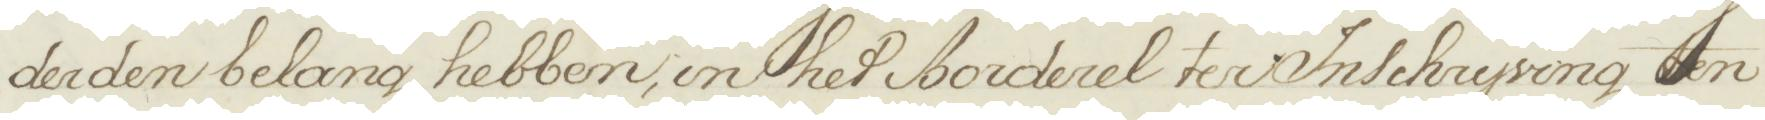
derden belang hebben, in het Borderel ter Inschryving den
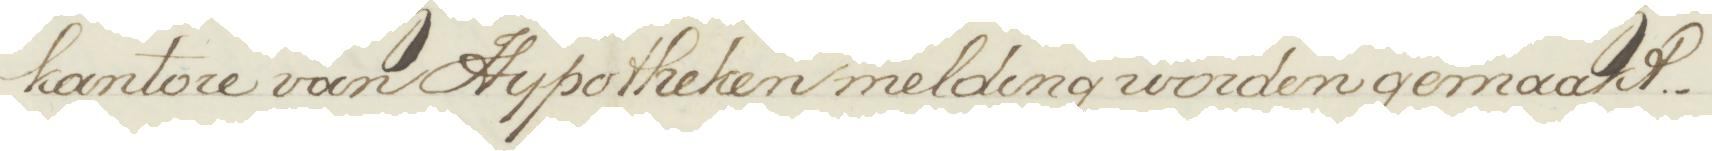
kantore van Hypotheken melding worden gemaakt.
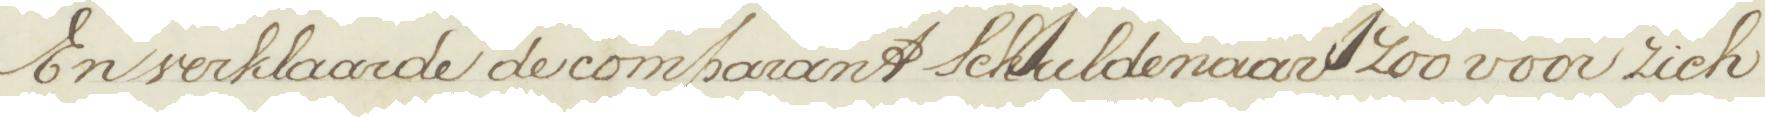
En verklaarde de comparant schuldenaar zoo voor zich
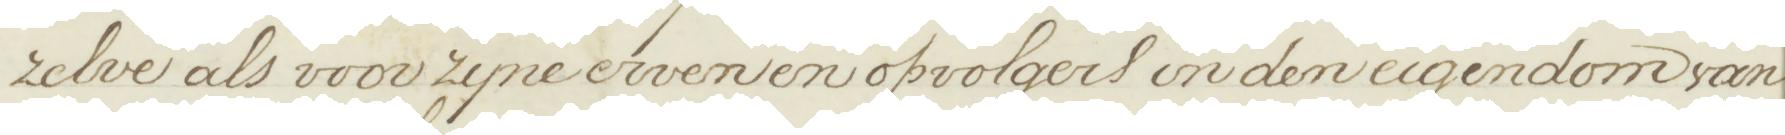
zelve als voor zyne erven en opvolgers in den eigendom van
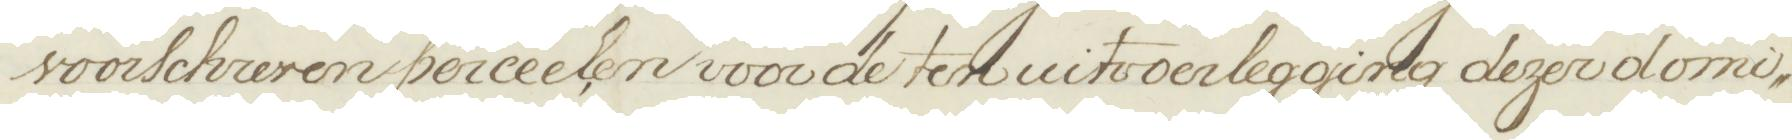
voorschreven perceelen voor de ten uitvoerlegging dezer domi„
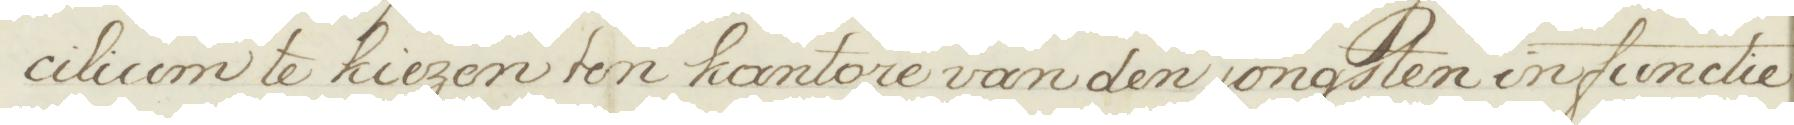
cilium te kiezen ten kantore van den jongsten in functie
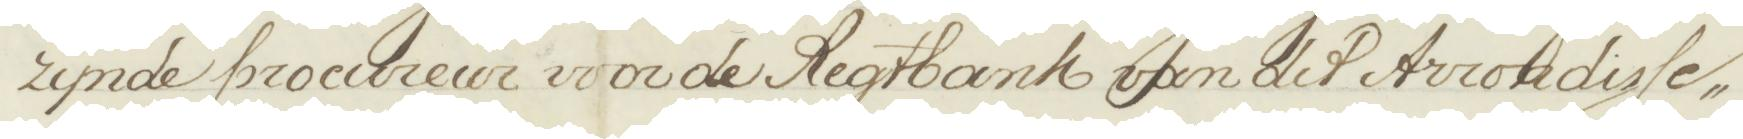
zynde procureur voor de Regtbank van dit Arrondisse„
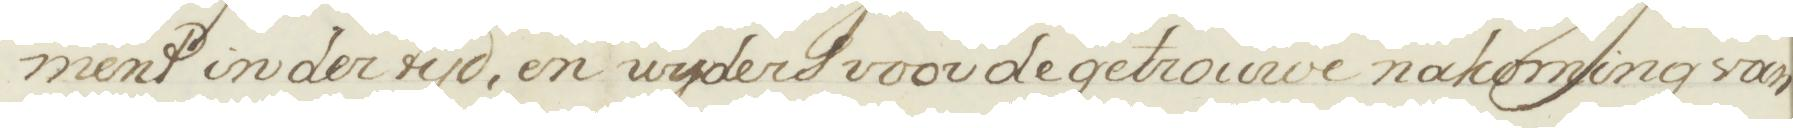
ment in der tyd, en wyders voor de getrouwe nakoming van
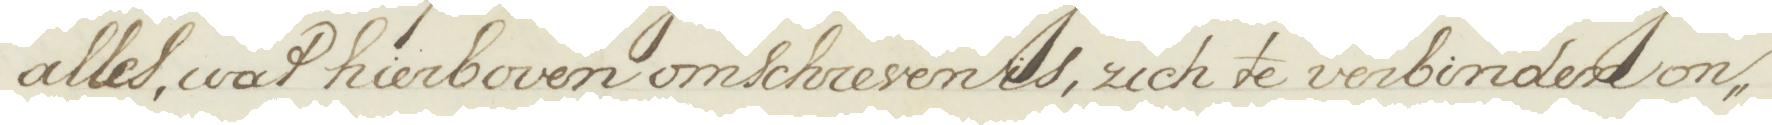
alles, wat hierboven omschreven is, zich te verbinden on„
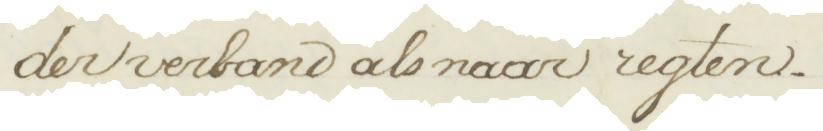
der verband als naar regten_
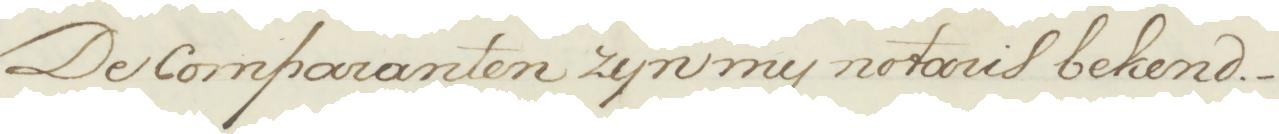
De comparanten zyn my notaris bekend.-
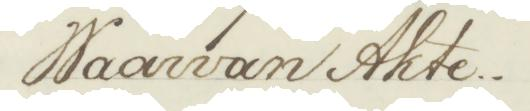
Waarvan Akte..
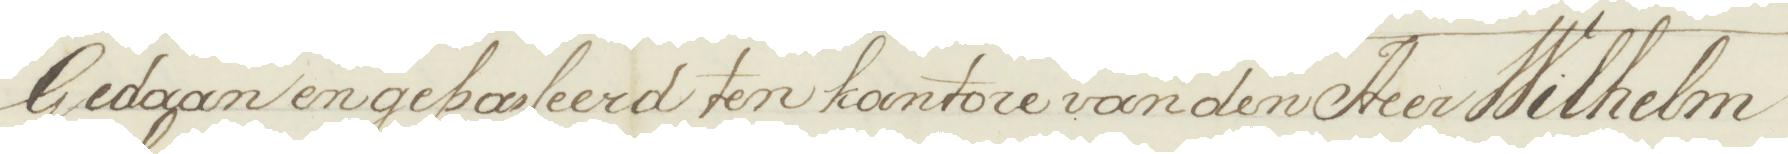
Gedaan en gepasseerd ten hantore van den Heer Wilhelm
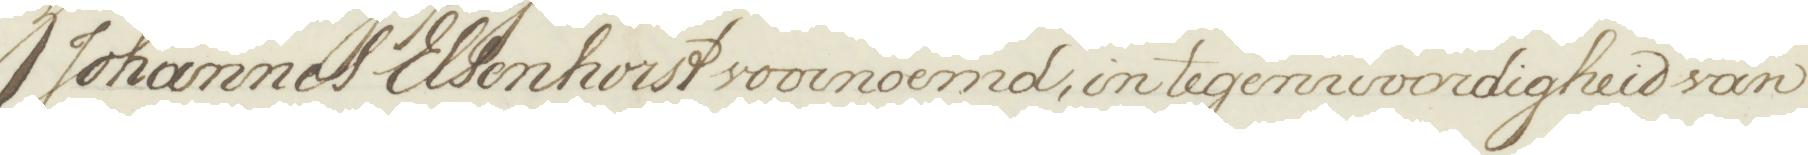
Johannes Elsenhout voornoemd, in tegenwoordigheid van
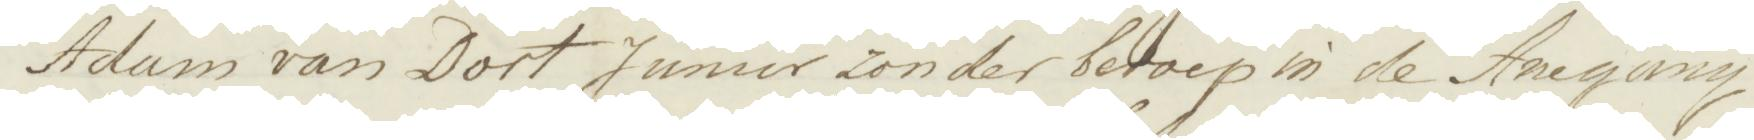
Adam van Dort Junior zonder beroep in de Anegang
